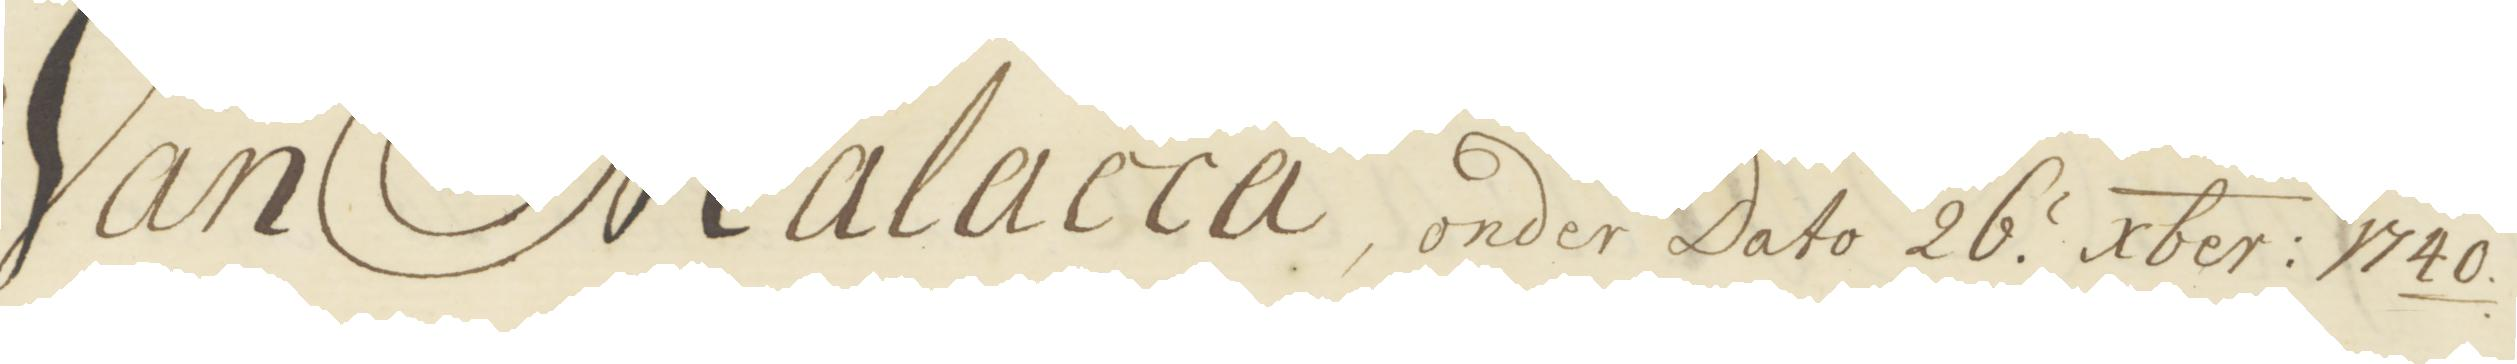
Van Malacca, onder Dato 26.' xber: 1740.
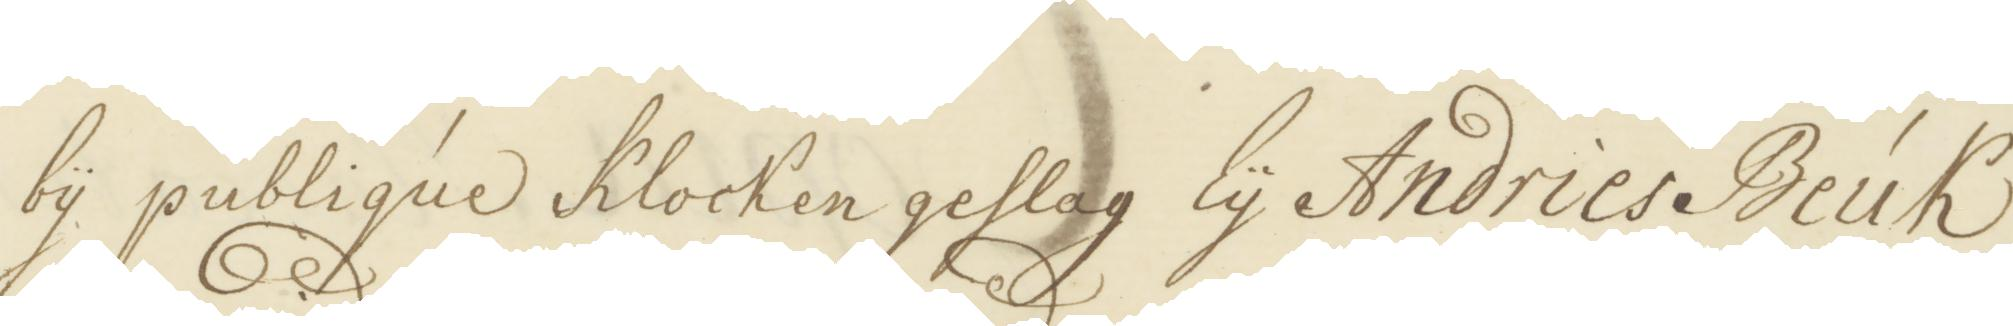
bij publique klocken geslag hij Andries Beuk
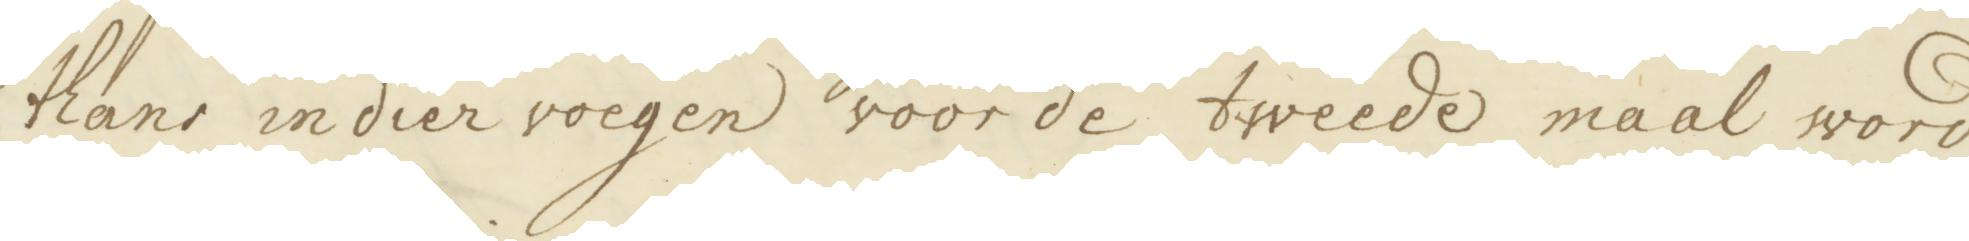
thans in dier voegen voor de tweede maal word
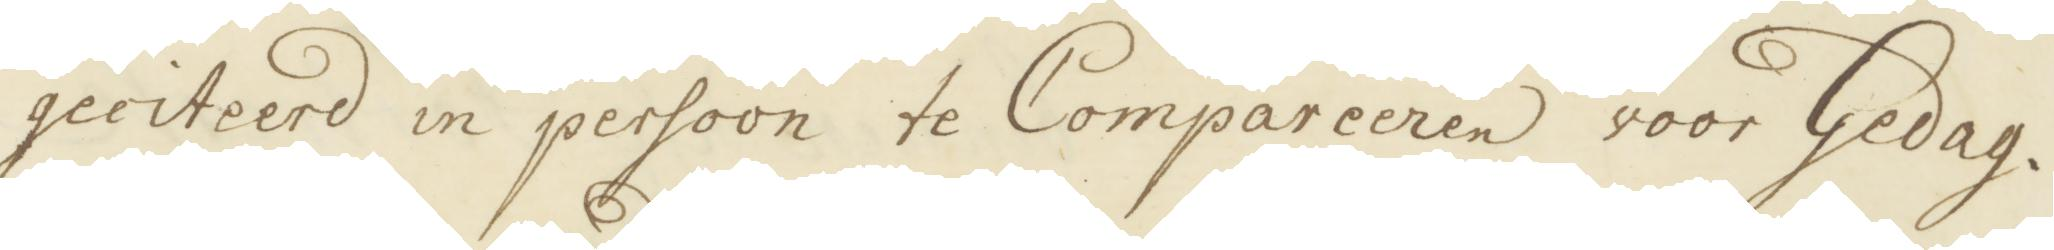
geciteerd in persoon te Compareeren voor Gedag„
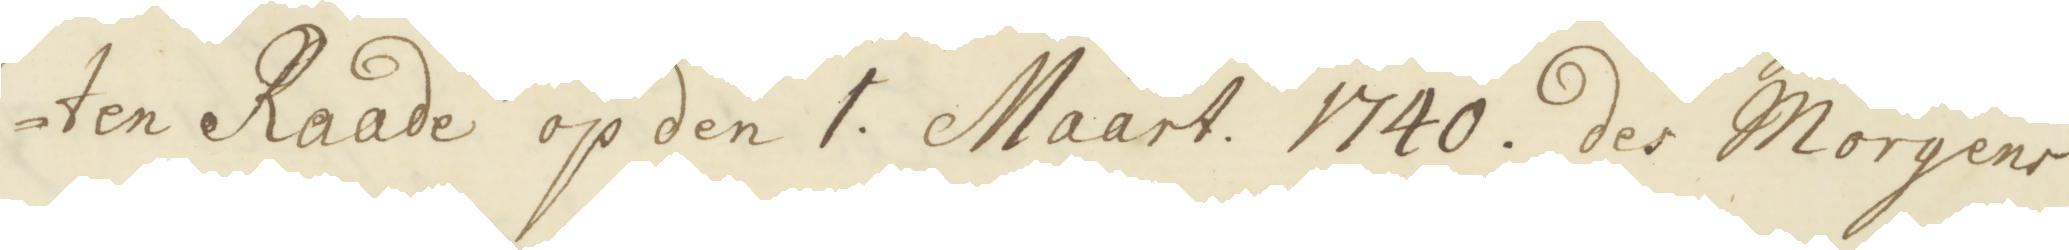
=ten Raade op den 1. Maart. 1740. des morgens
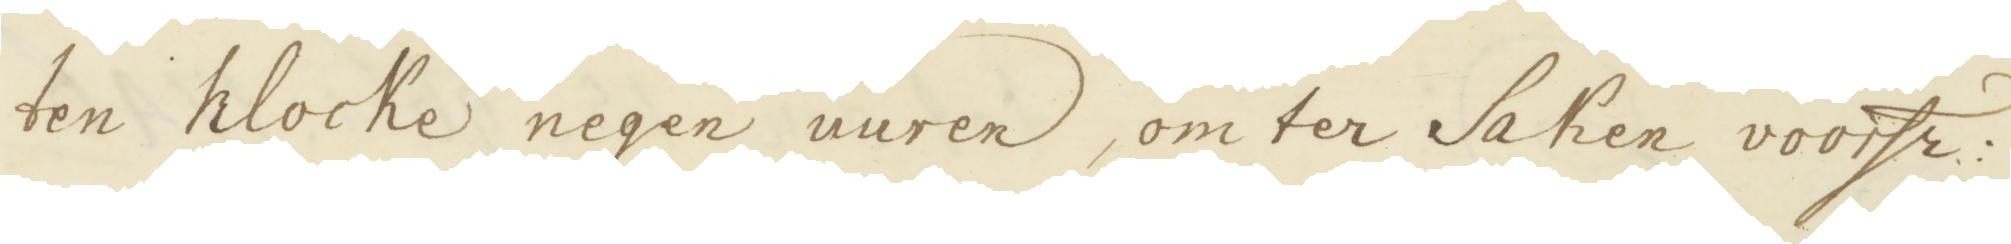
ten klocke negen uuren, om ter saken voorsz:
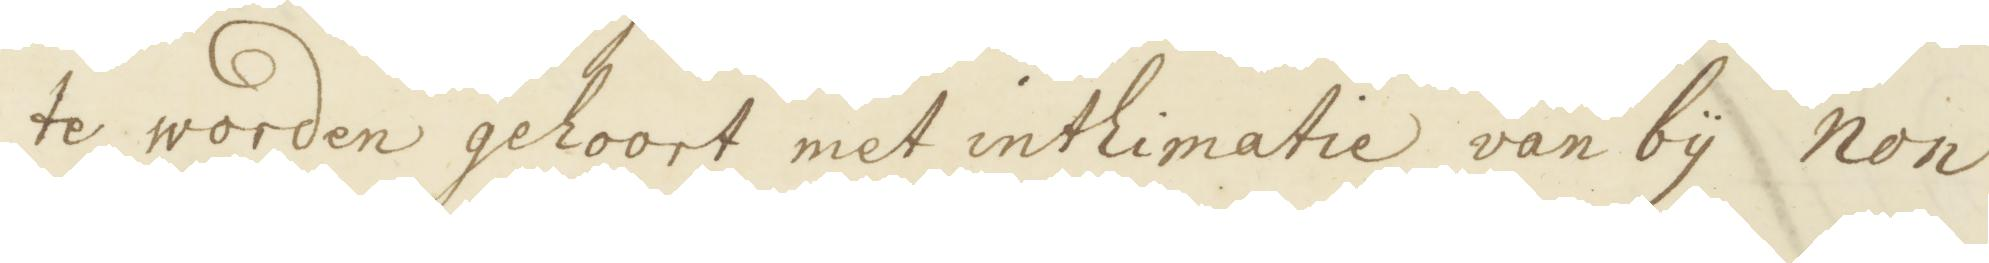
te worden gehoort met inthimatie van bij non
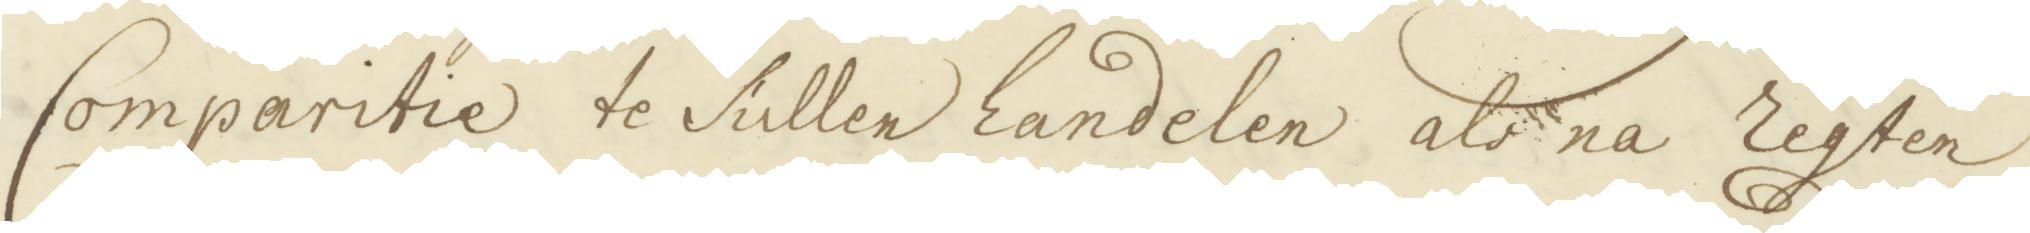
comparitie te sullen handelen als na regten
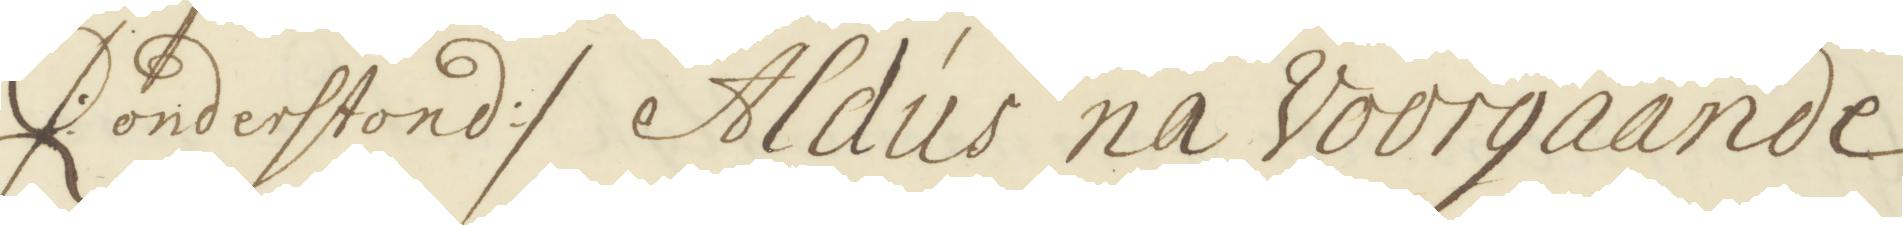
/:onderstond:/ Aldus na voorgaande
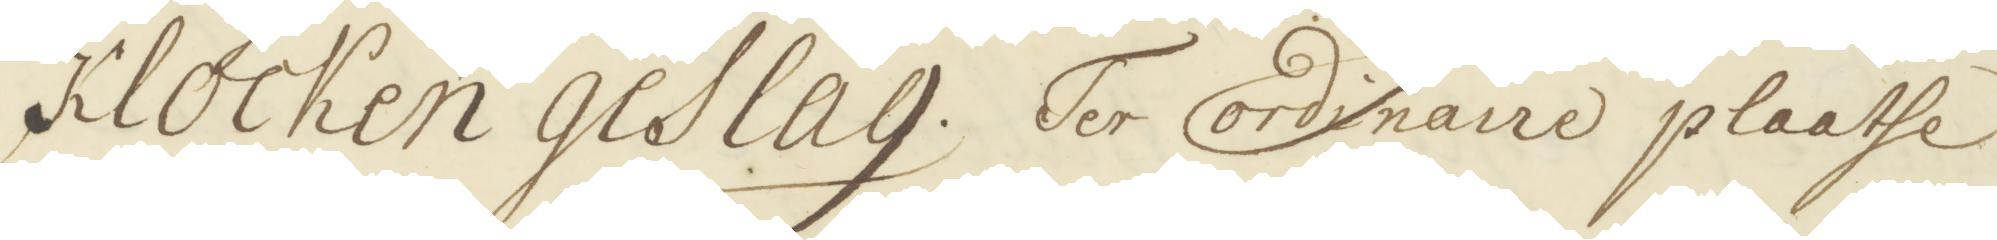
klocken geslag. Ter ordinaire plaatse
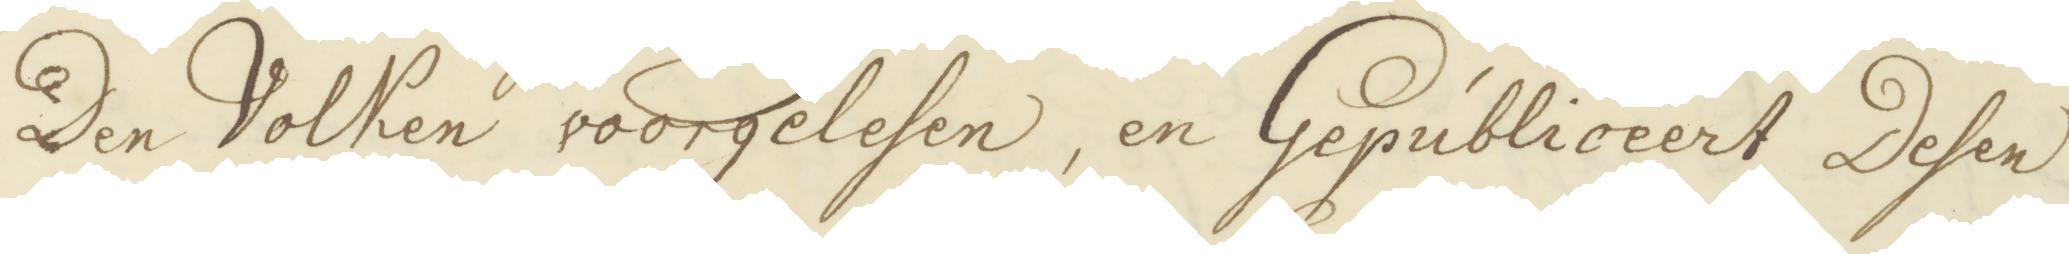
Den Volken voorgelesen, en Gepubliceert Desen
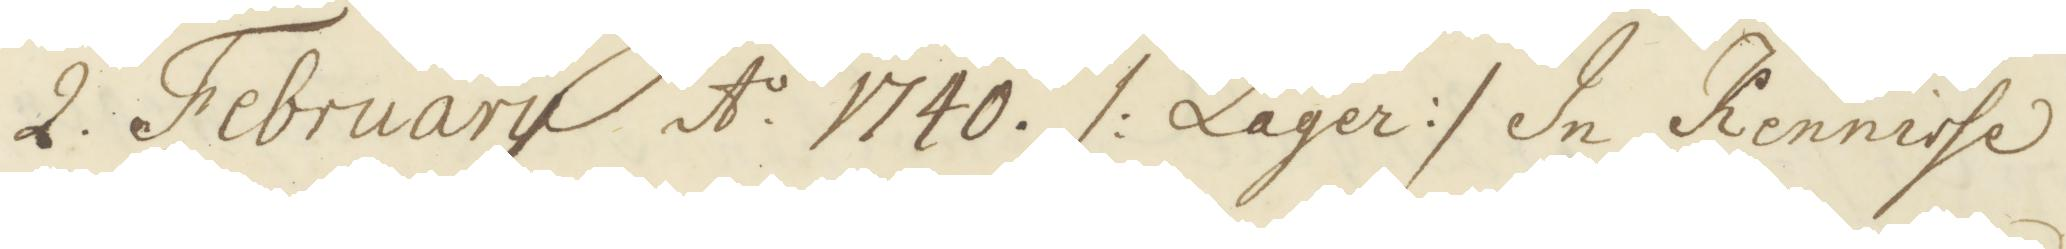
2. Februarij A.o 1740. /:Lager:/ In Kennisse
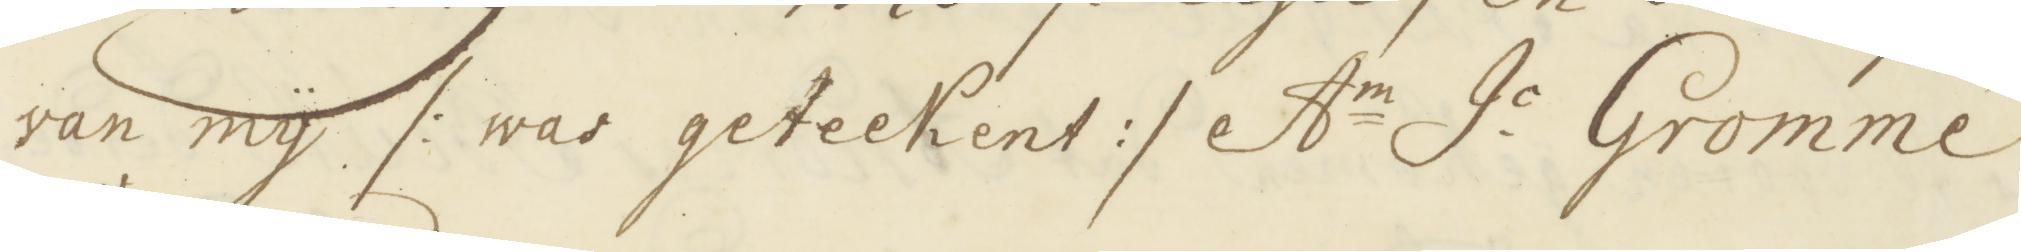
van mij /:was geteekent:/ A=m J.c Gromme
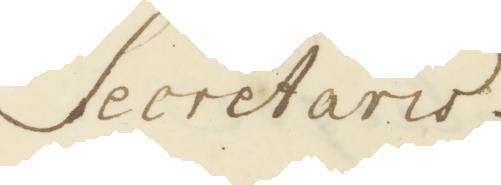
Secretaris.
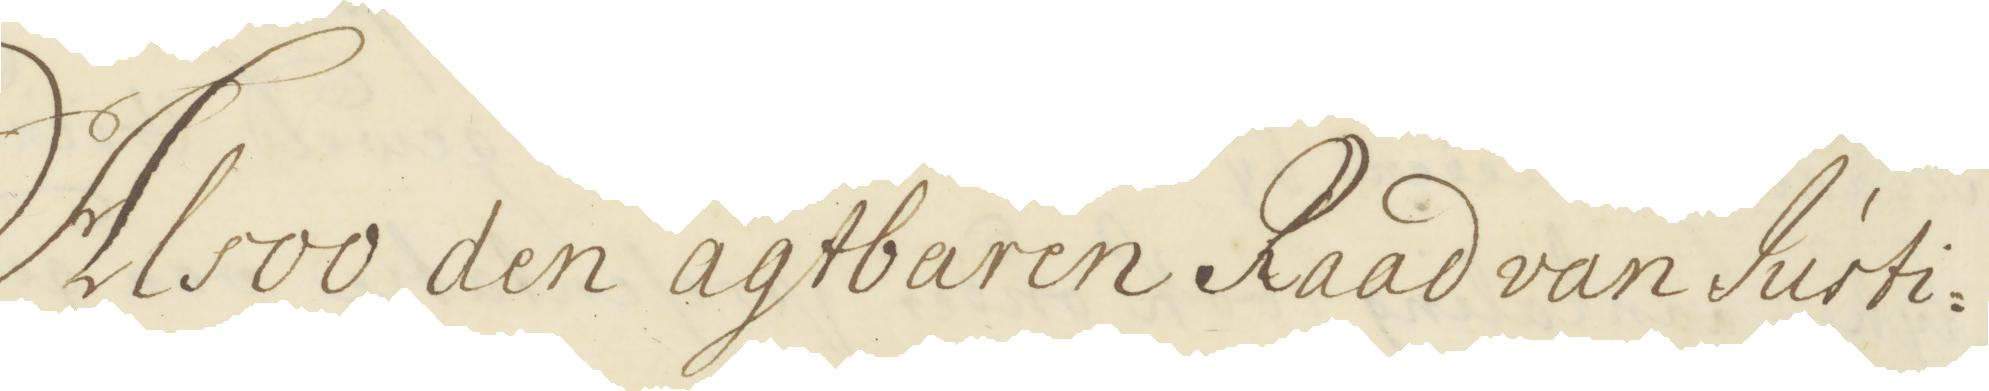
Alsoo den agtbaren Raad van Iusti=
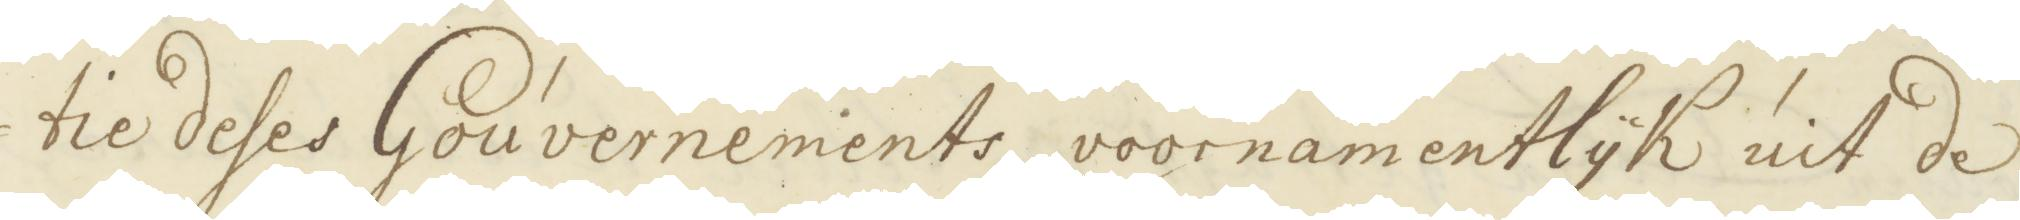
=tie deses Gouvernements voornamentlijk uit de
